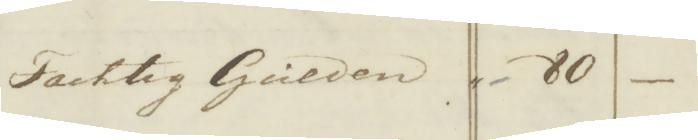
Tachtig Gulden „- 80 —
